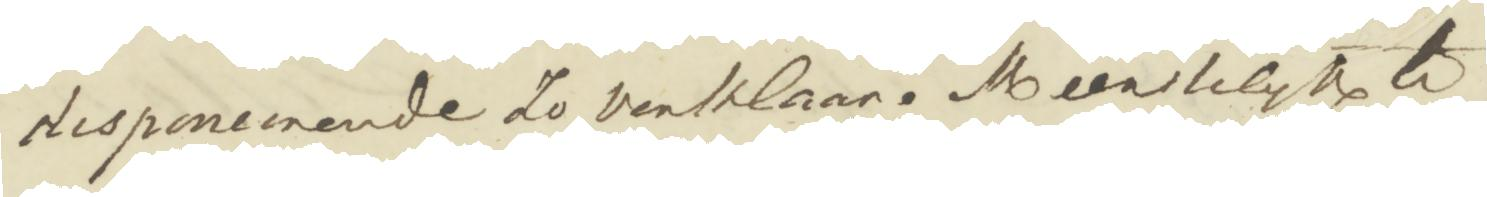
disponeerende zo verklaare ik eerstelyk te
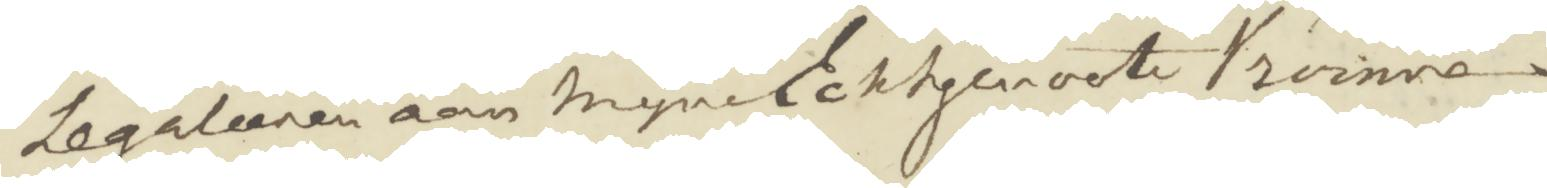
Legateeren aan myne Echtgenoote Vrouwe
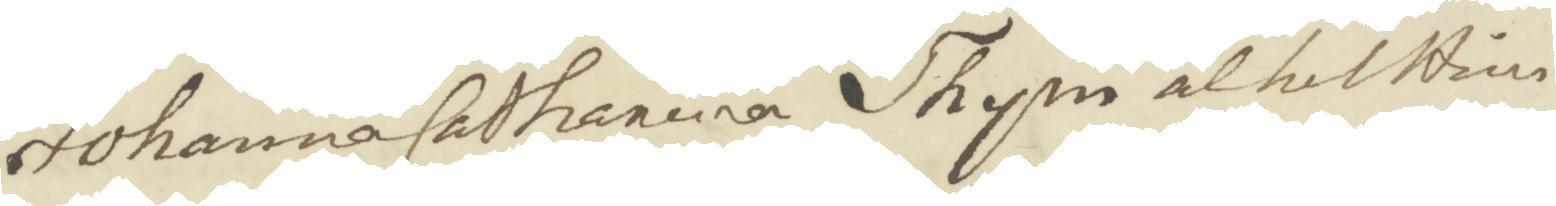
Johanna Catharina Thym al het huis
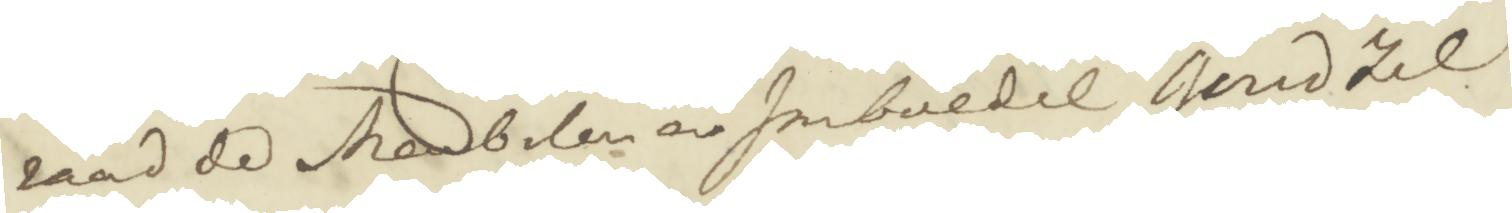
raad de Meubilen en Jnboedel goud zil
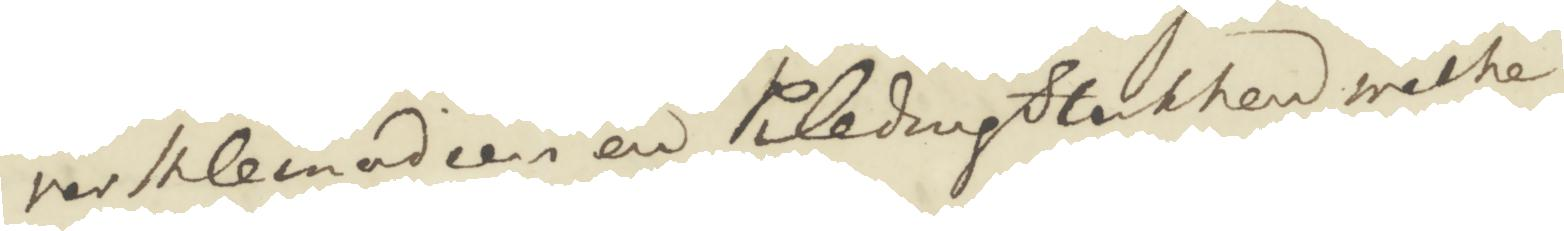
ver kleinodien en kleding stukken welke
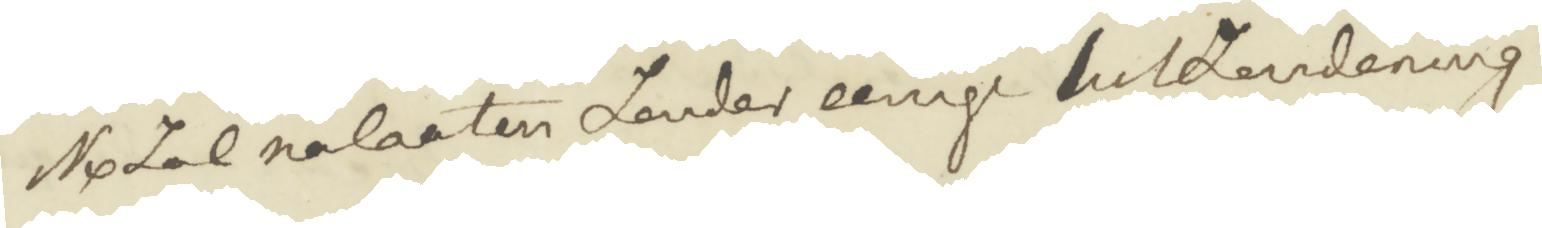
ik zal nalaaten zonder eenige uitzondering
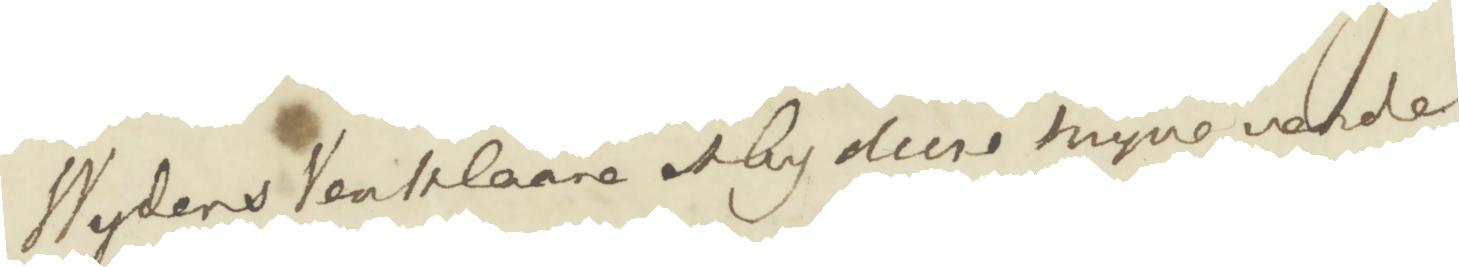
Wyders Verklaare ik by deeze myne verde
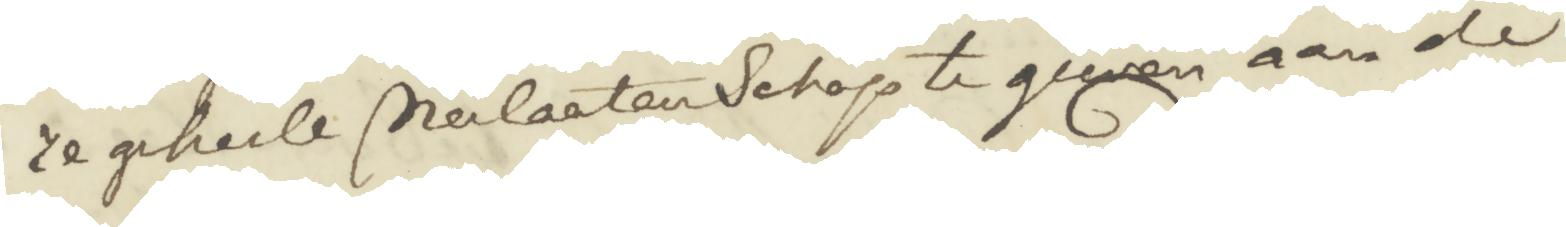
re geheele Nalaatenschap te geeven aan de
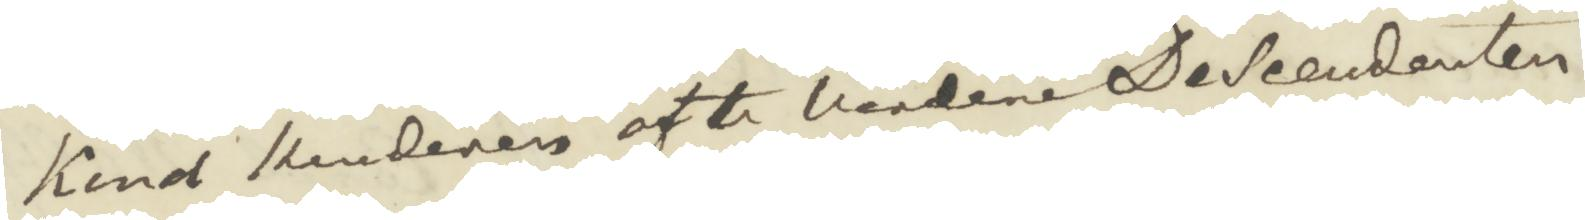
kind kinderen of te verdere Descendenten
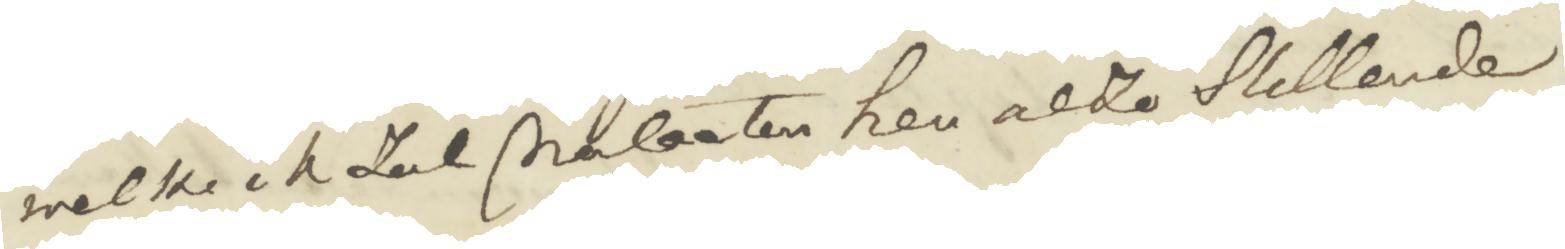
welke ik zal nalaaten hen alzo stellende
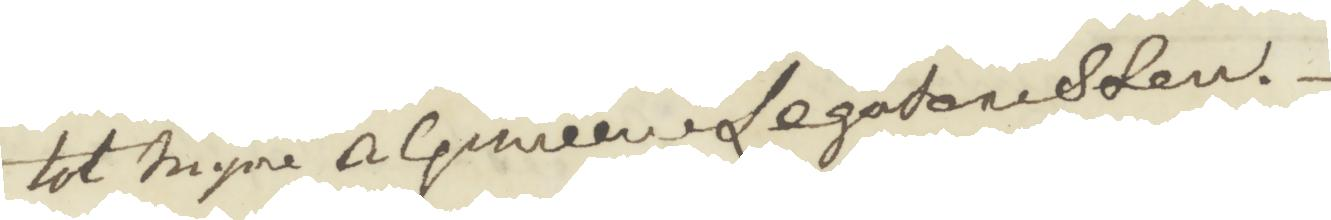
tot myne algemeene Legatarissen.
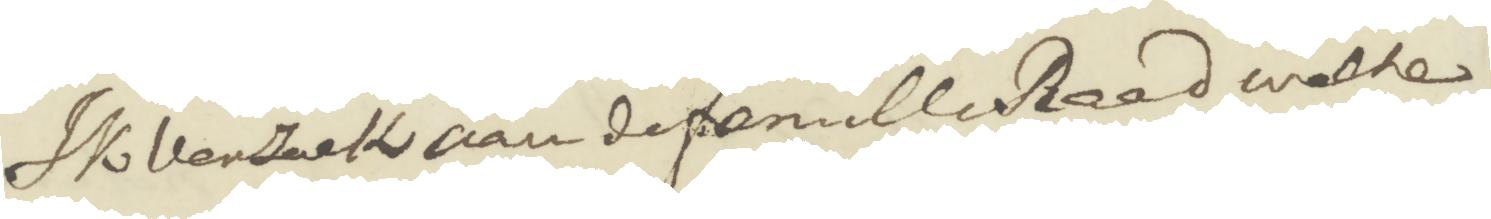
Ik verzoek aan de famille Raad welke
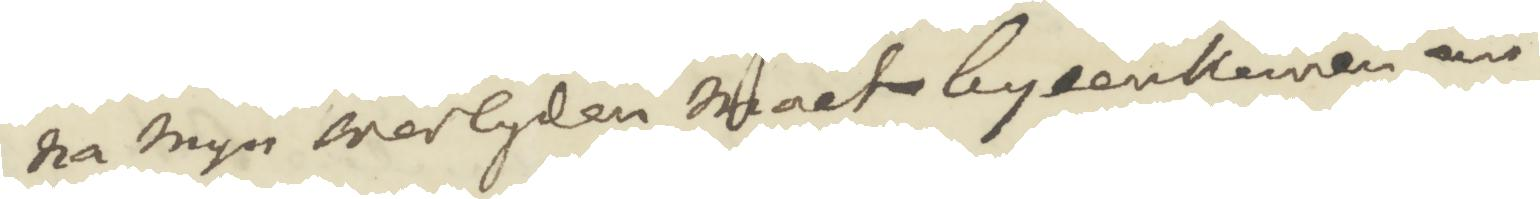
na myn overlyden moet byeenkomen en
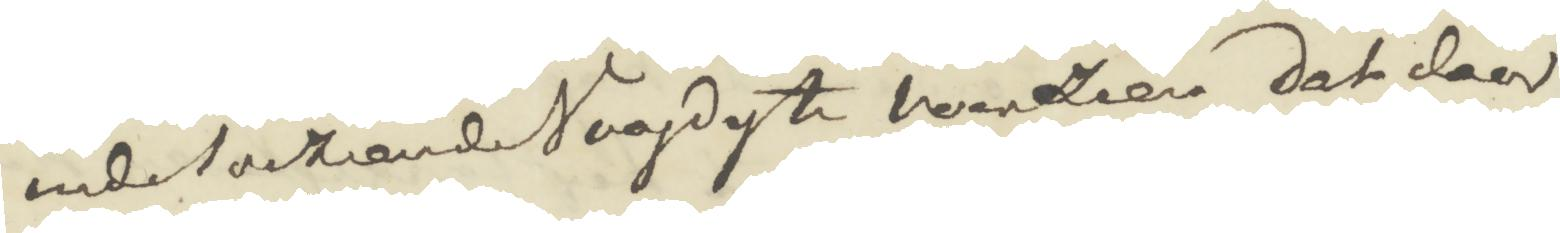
in de toeziende Voogdy te voorzien dat daar
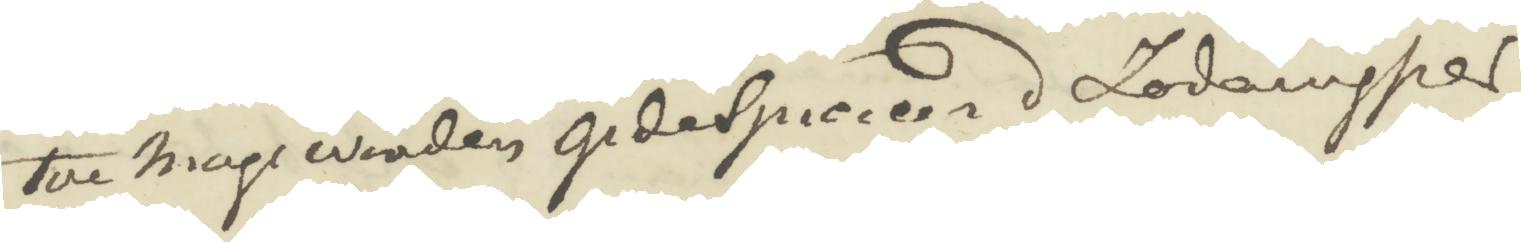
toe moge worden gedespicieerd Zodanig per
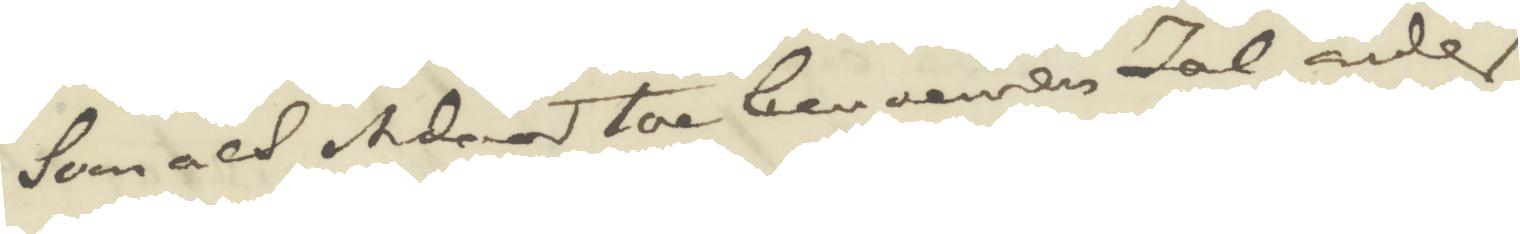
soon als ik daar toe benoemen zal onder
